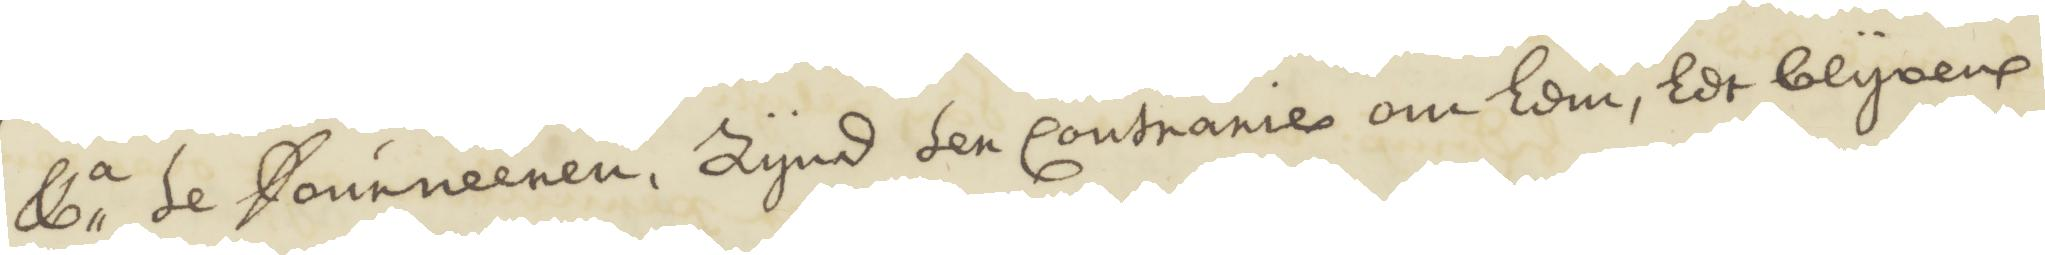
&„a te fourneeren, zijne ter Contrarie om hem, het blijven
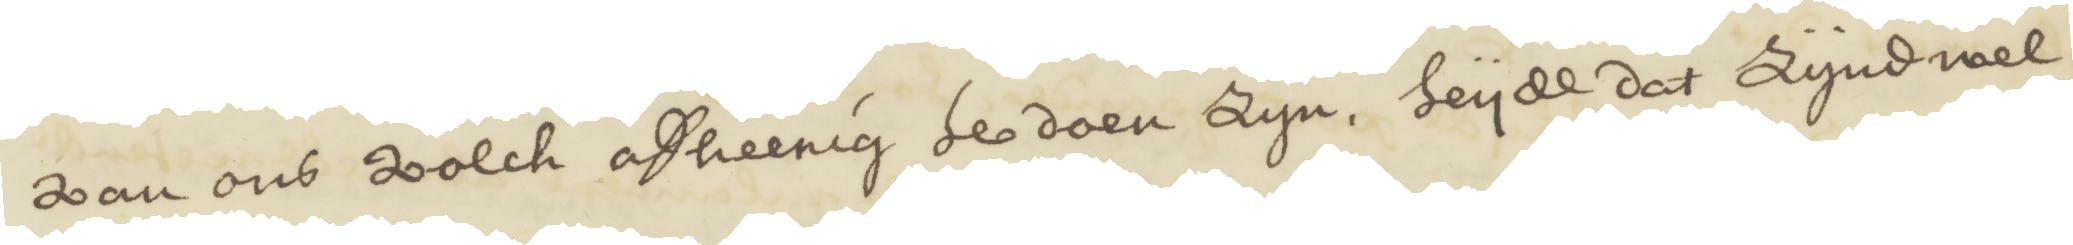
van ons volck afkeerig te doen zijn, seijde dat zijne wel
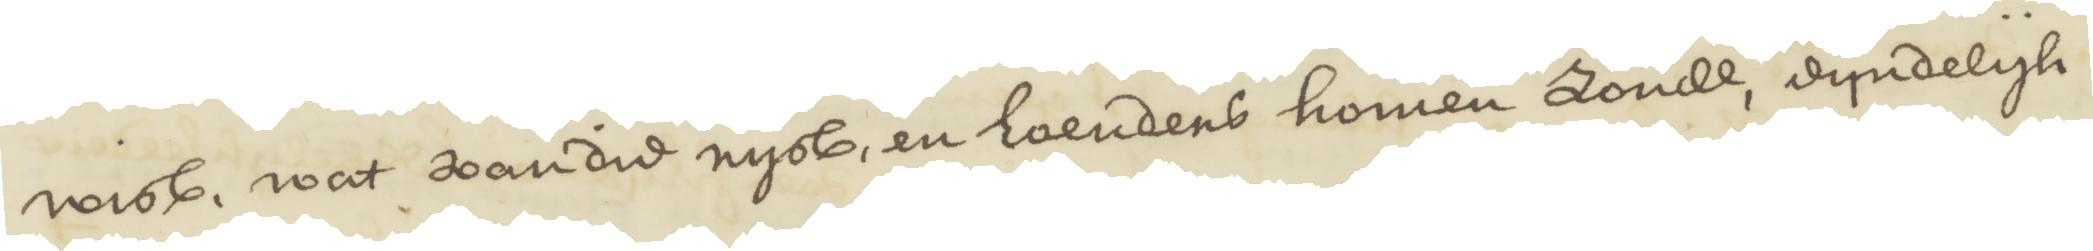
wist, wat van die rijst, en hoenders komen zoude, eijndelijk
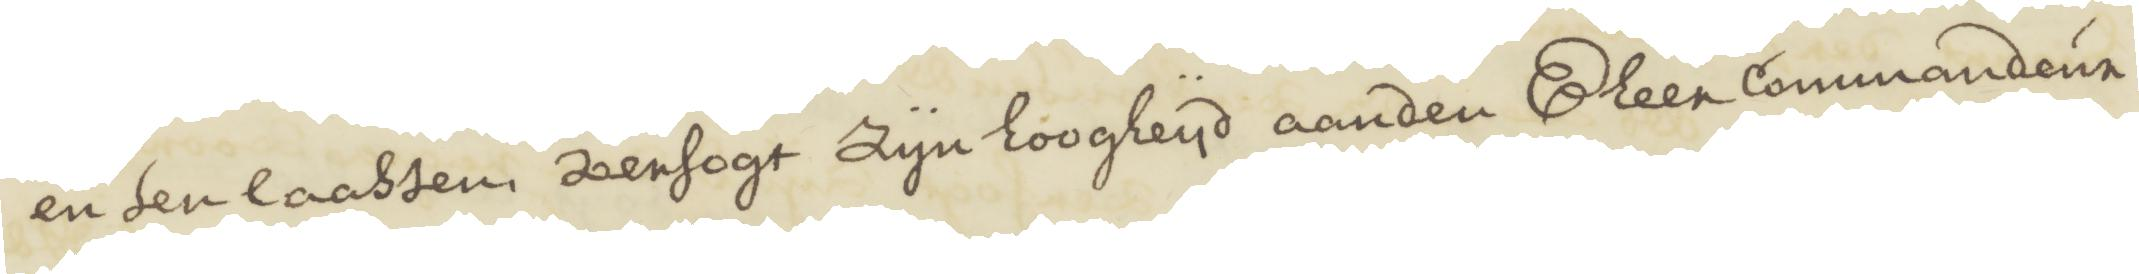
en ten laasten, versogt zijn hoogheijd aan den Eheer commandeur
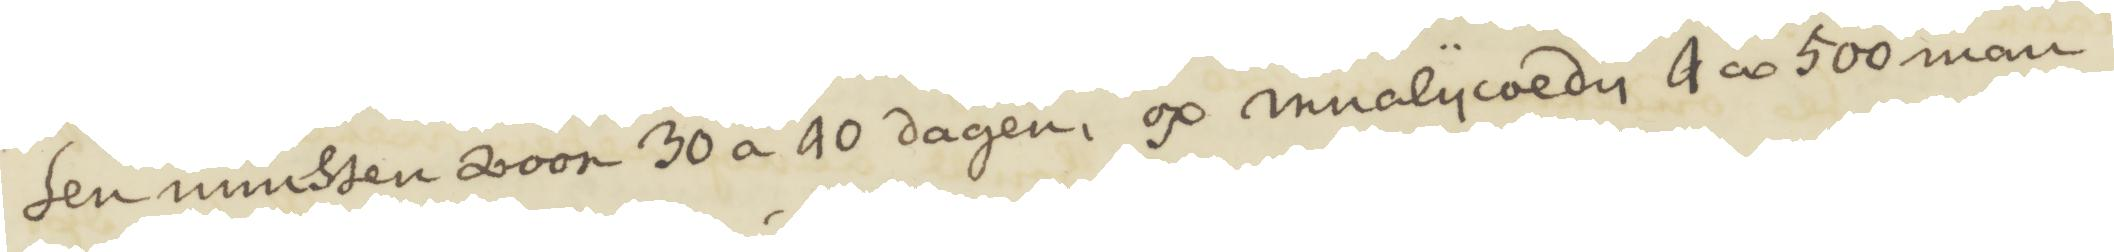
ten minsten voor 30 a 40 dagen, op mualij coedij 4 a 500 man
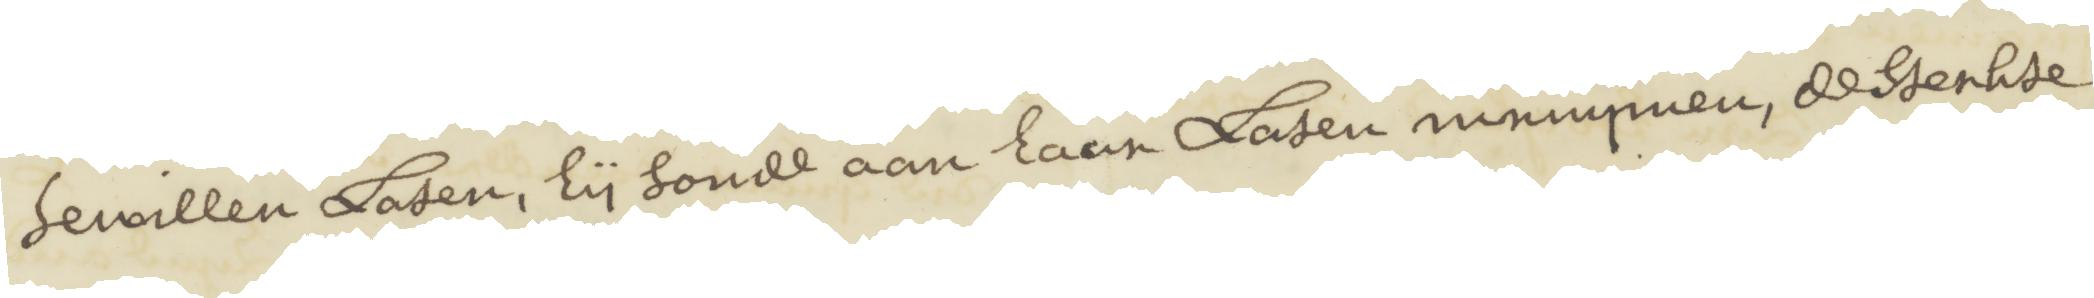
tewillen Laten, hij soude aan haar Laten inruijmen, de sterkse
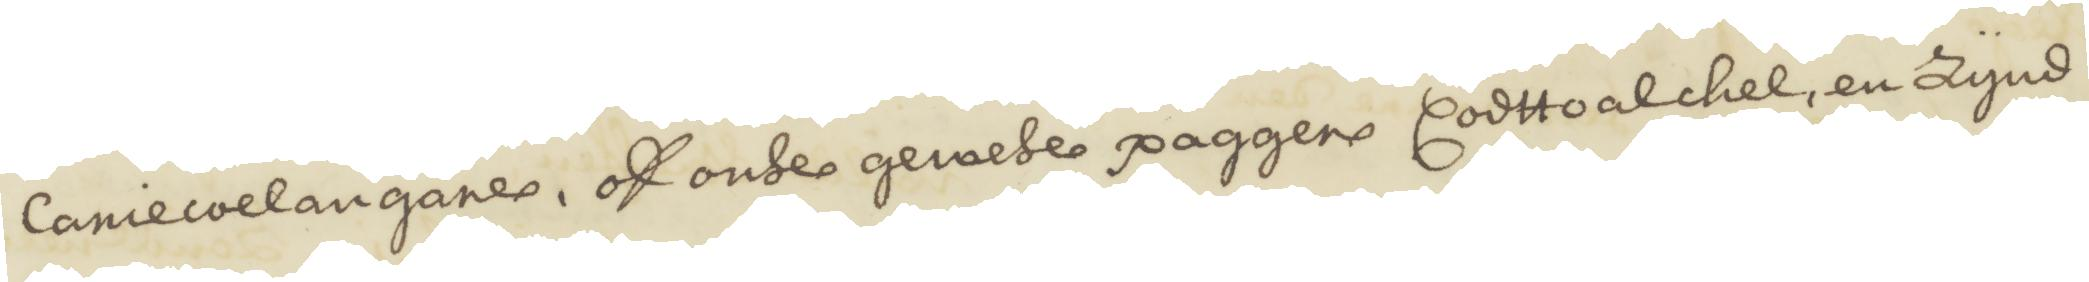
cariewelangare, of onse gewese pagger Coetto alckel, en zijne
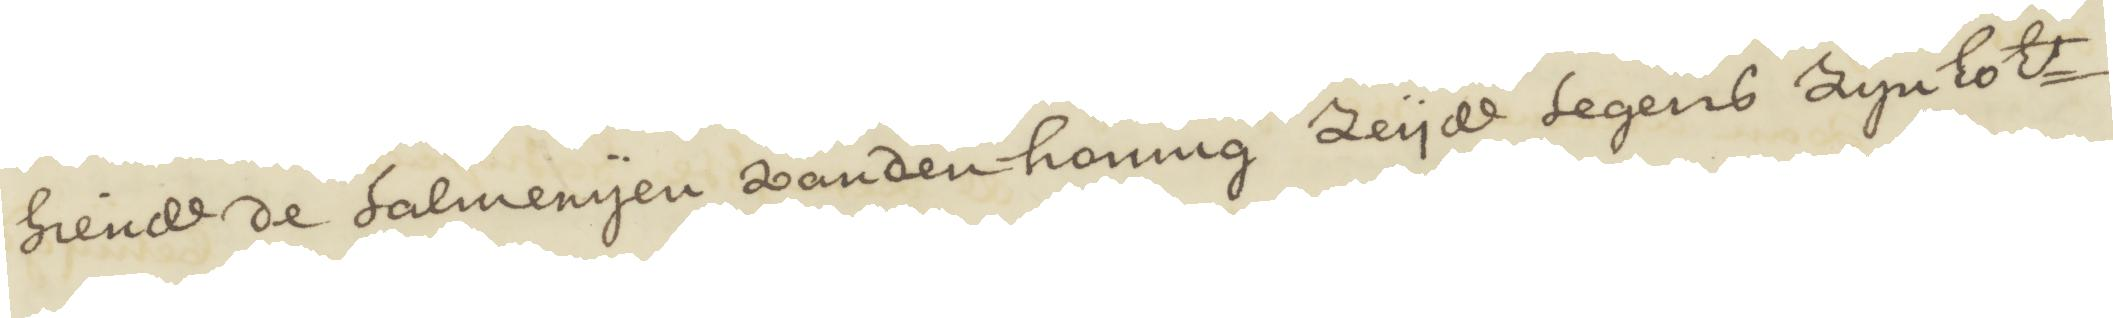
siende de talmerijen van den koning zeijde tegens zijn hoh=t
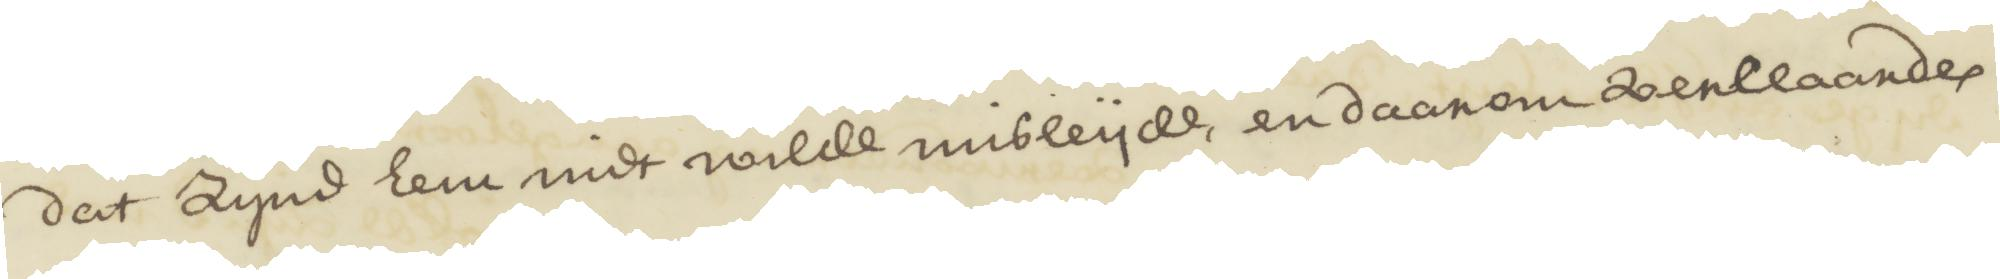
dat zijne hem niet wilde misleijde, en daarom verclaarde
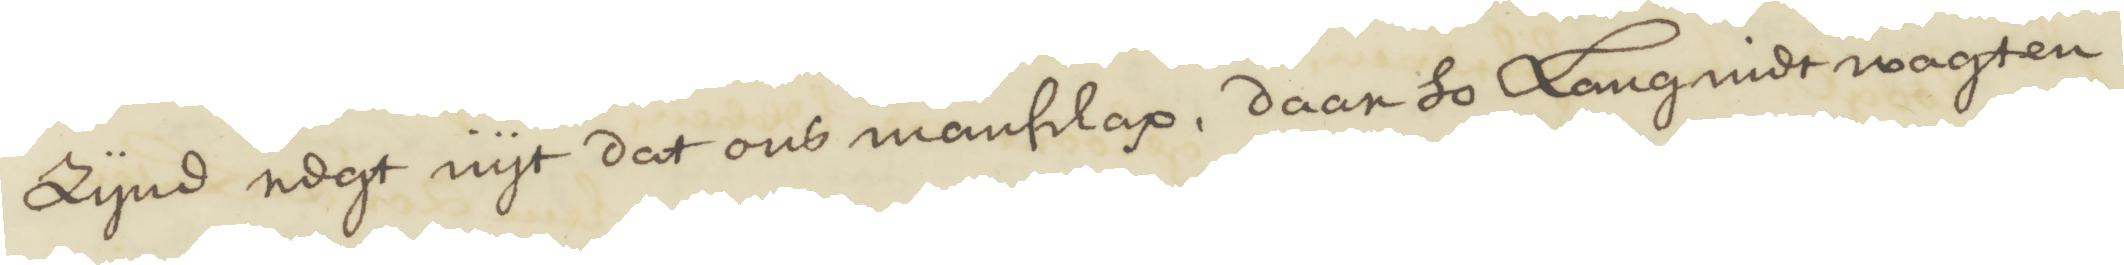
zijne regt uijt dat ons manschap, daar so Lang niet wagten
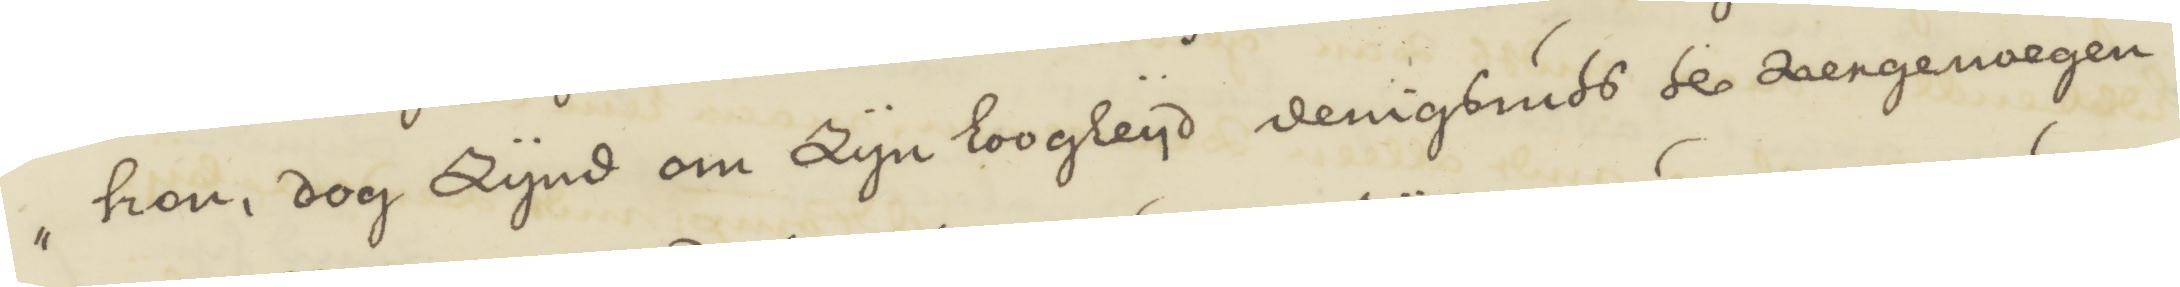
„ kon, dog zijne om zijn hoogheijd eenigsints te vergenoegen
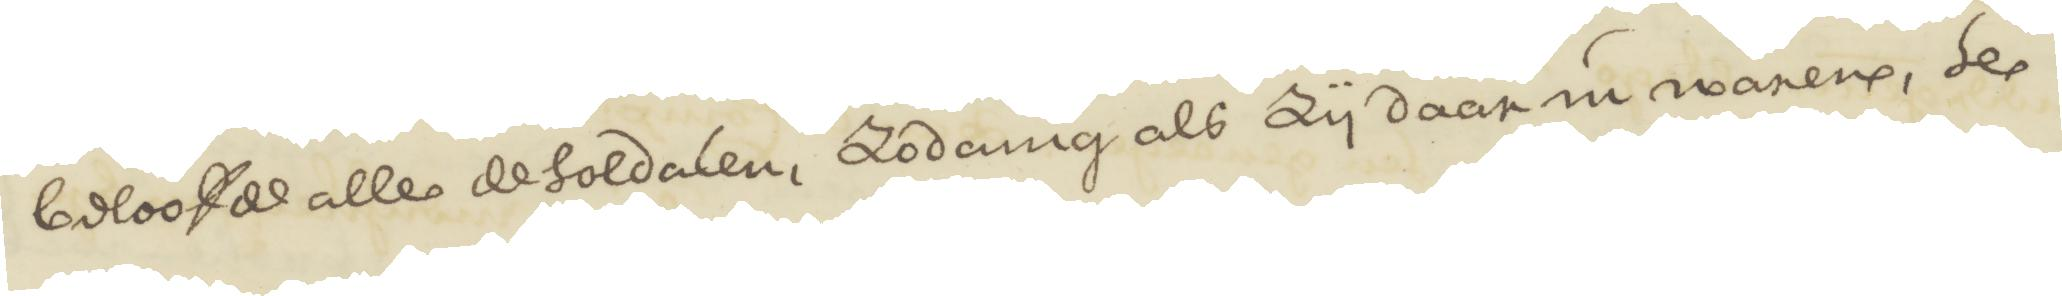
beloofde alle de soldaten, zodanig als zij daar in waren, te
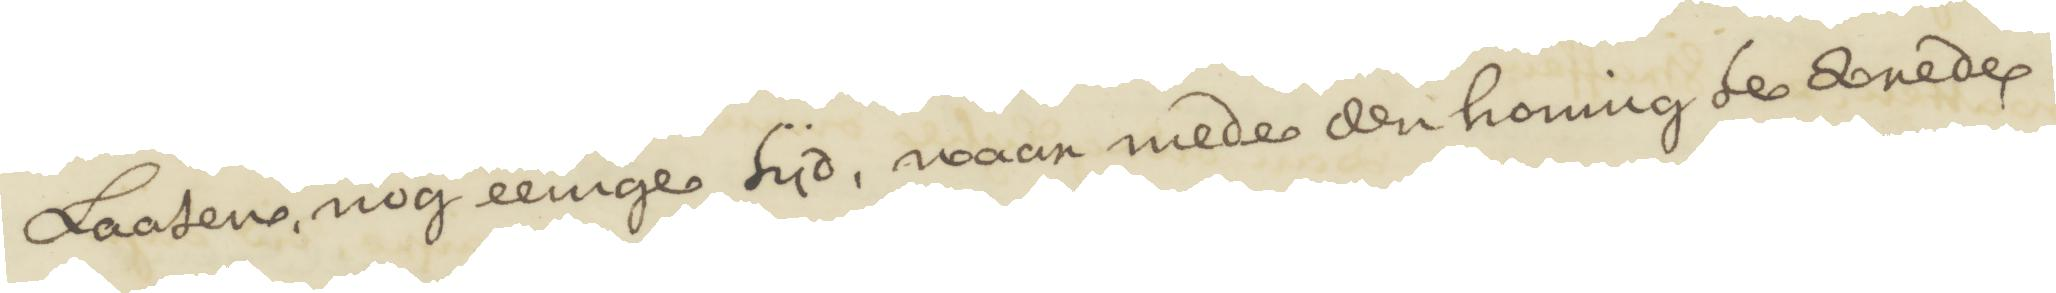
Laaten, nog eenige tijd, waar mede den koning te vrede
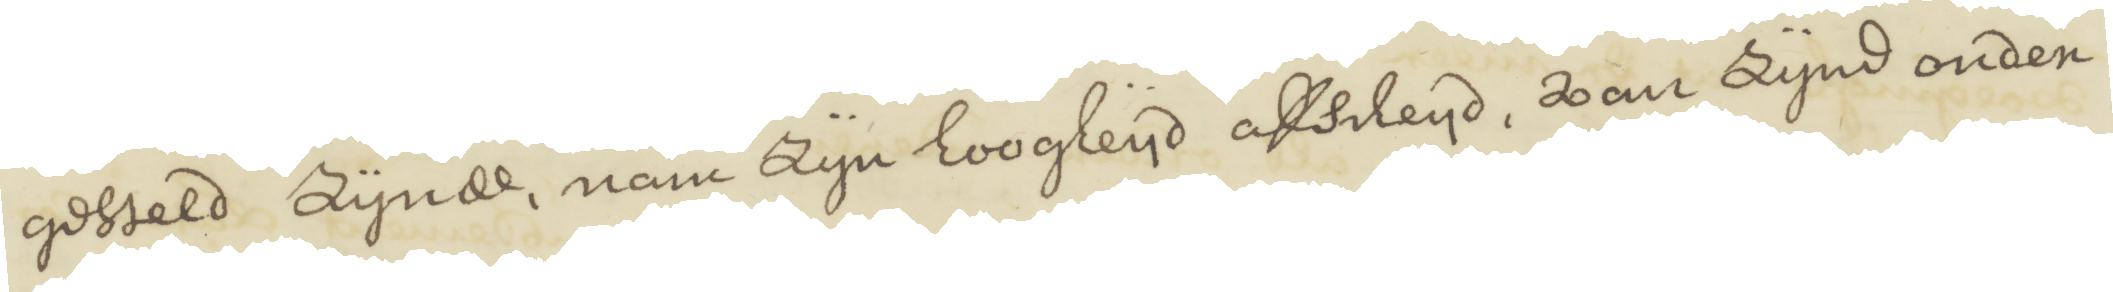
gesteld zijnde, nam zijn hoogheijd afscheyd, van zijne onder
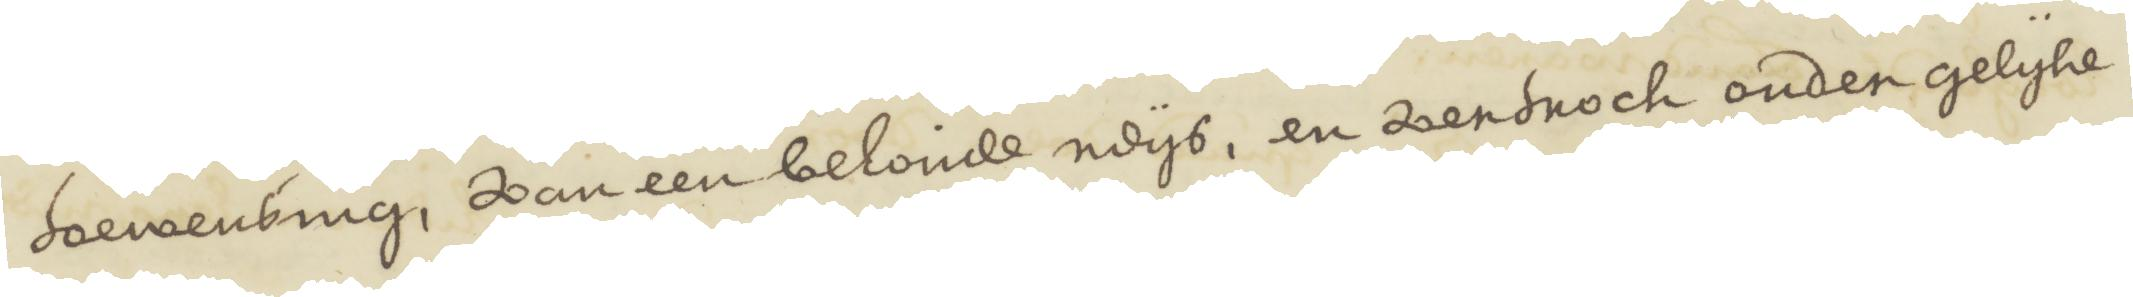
toewensing, van een behoude reijs, en vertrock onder gelijke
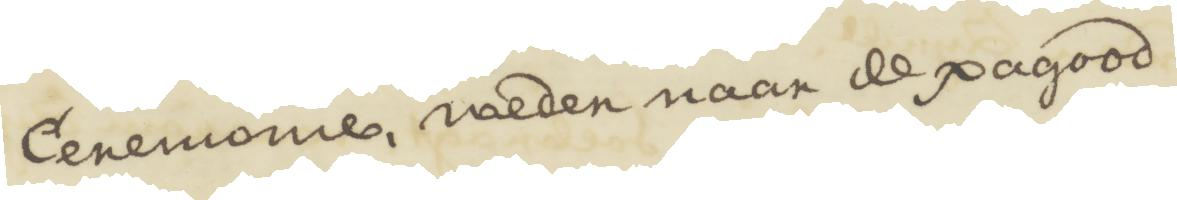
Ceremonie, weder naar de pagood
